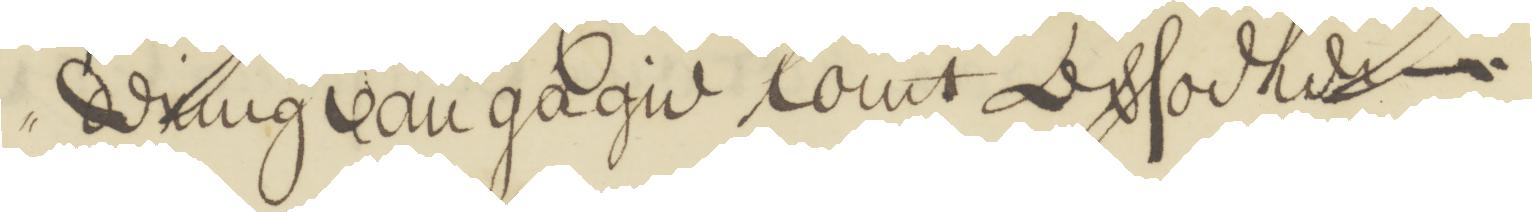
„dering van gagie komt te versoeken.
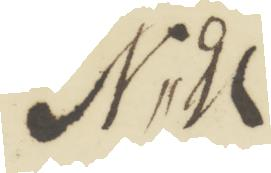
N„o 15
